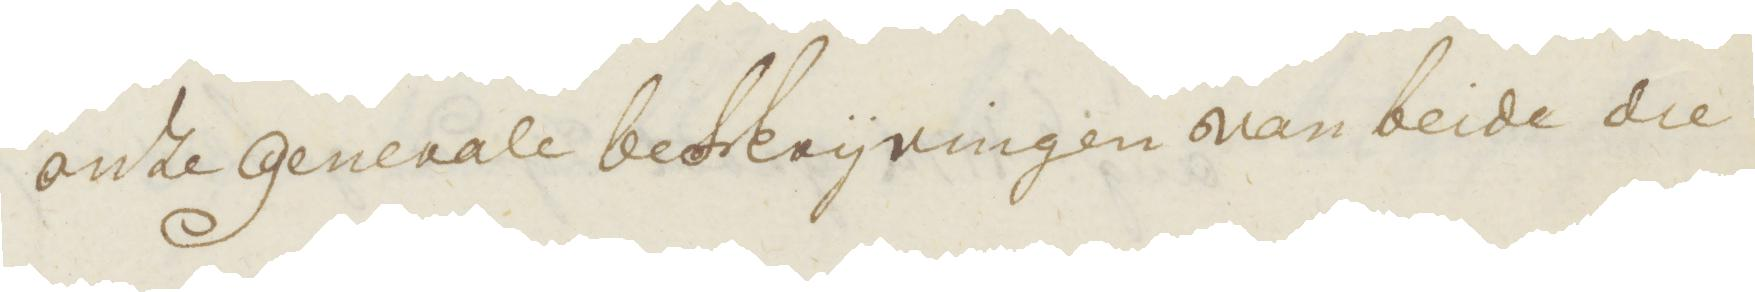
onze generale beschrijvingen van beide die
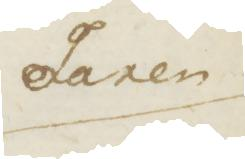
Jaren
